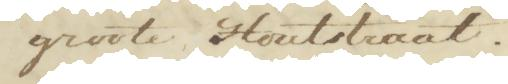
groote Houtstraat.
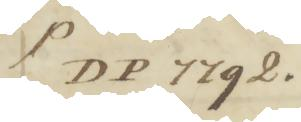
DP 7792.
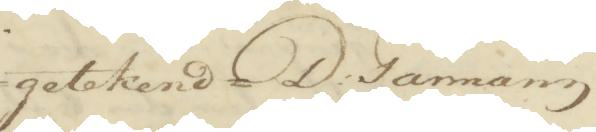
getekend = D: Parmann
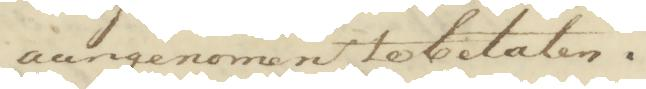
aangenomen te betalen.
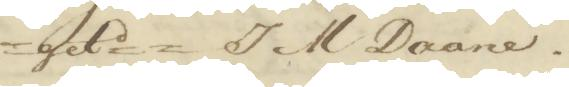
=get=d= I M Daane
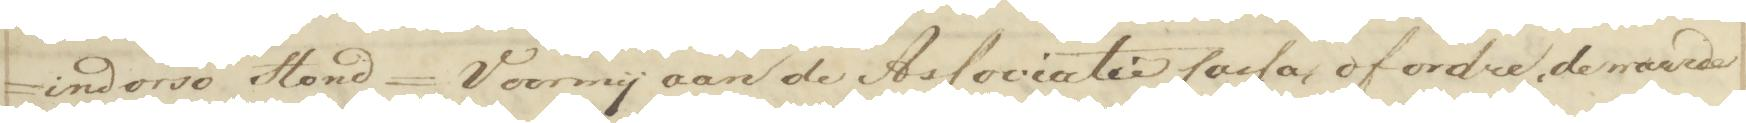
=indorso stond = Voor mij aan de Associatie Cassa, of ordre, de waarde
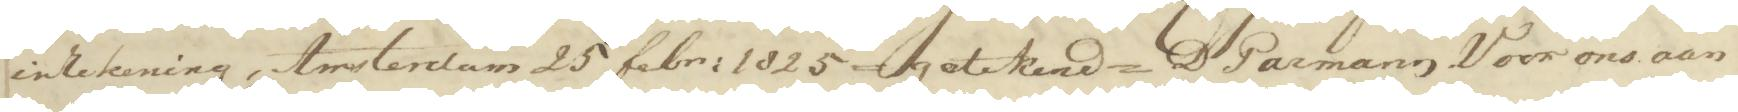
in rekening, Amsterdam 25 febr: 1825 = getekend = D Parmann. Voor ons aan
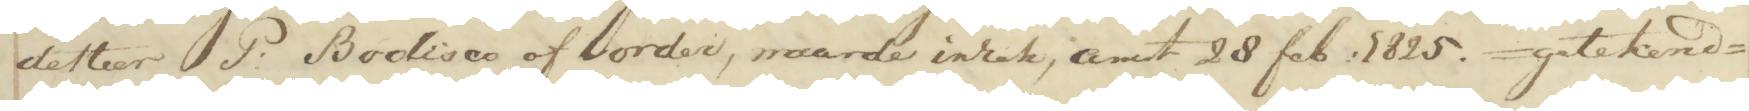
de Heer P: Bodisco of order, waarde inrek, amt 28 feb: 1825. = getekend=
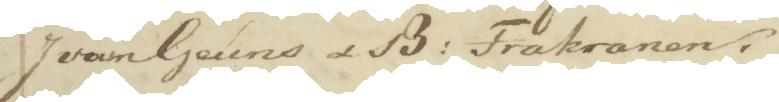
Joan Geuns & B: Trakranen.
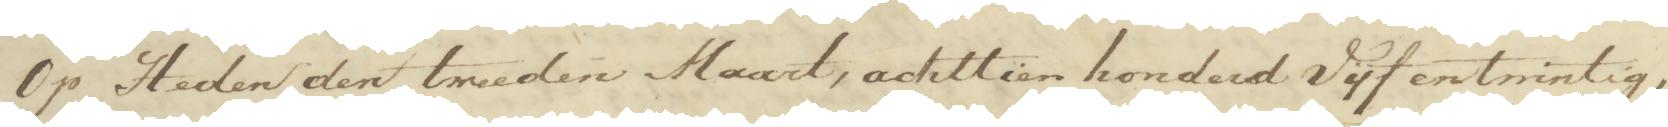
Op Heden den tweeden Maart, achttien honderd Vijf en twintig
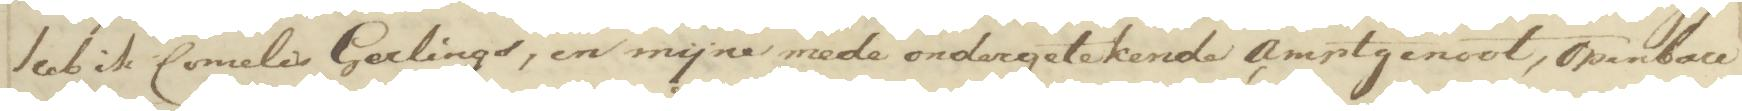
heb ik Cornelis Gerlings, en mijne mede ondergetekende amptgenoot, openbare
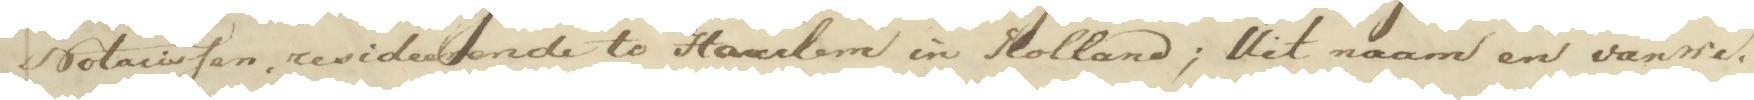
Notarissen, resideerende te Haarlem in Holland; Uit naam en van we„
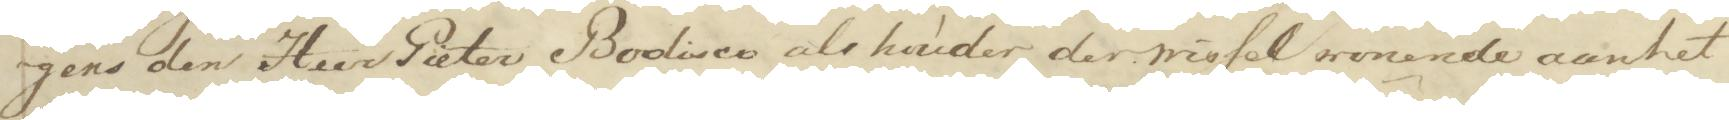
„gens den Heer Pieter Bodisco als houder der wissel wonende aan het
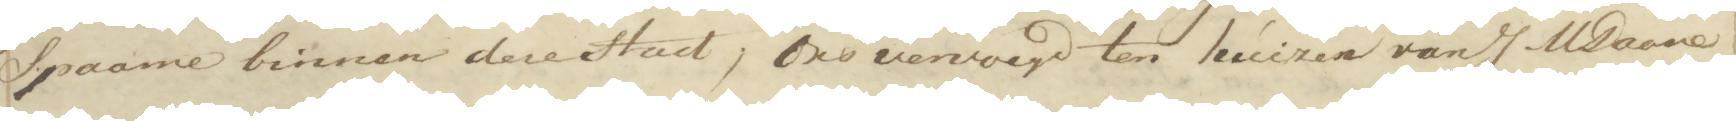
Spaarne binnen deze stad; ons vervoegd ten huizen van J. M Daane
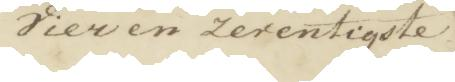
Vier en zeventigste
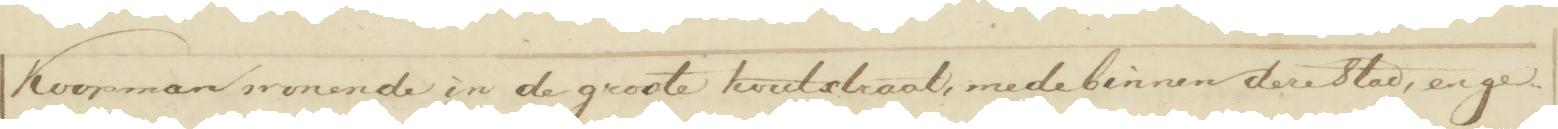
koopman wonende in de groote houtstraat, mede binnen deze stad, en ge„
